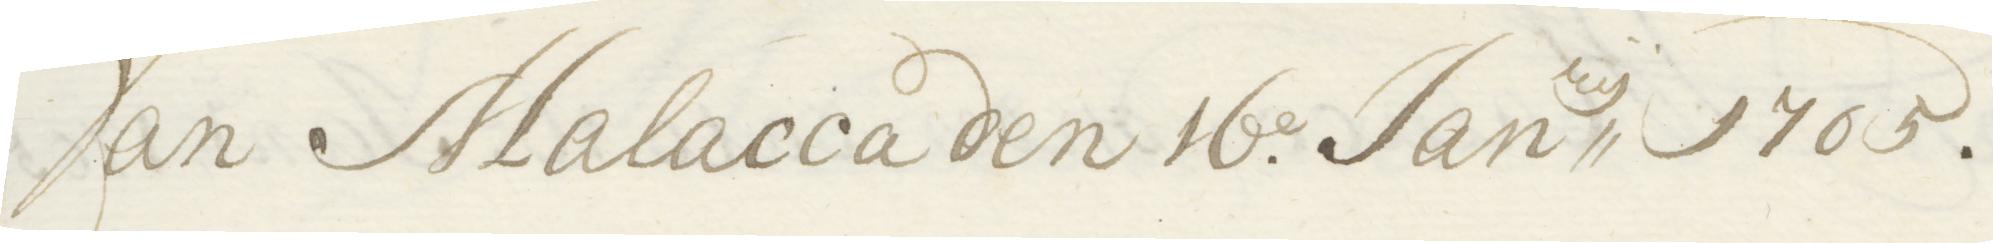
Van Malacca den 16.e Ian„rij 1765.
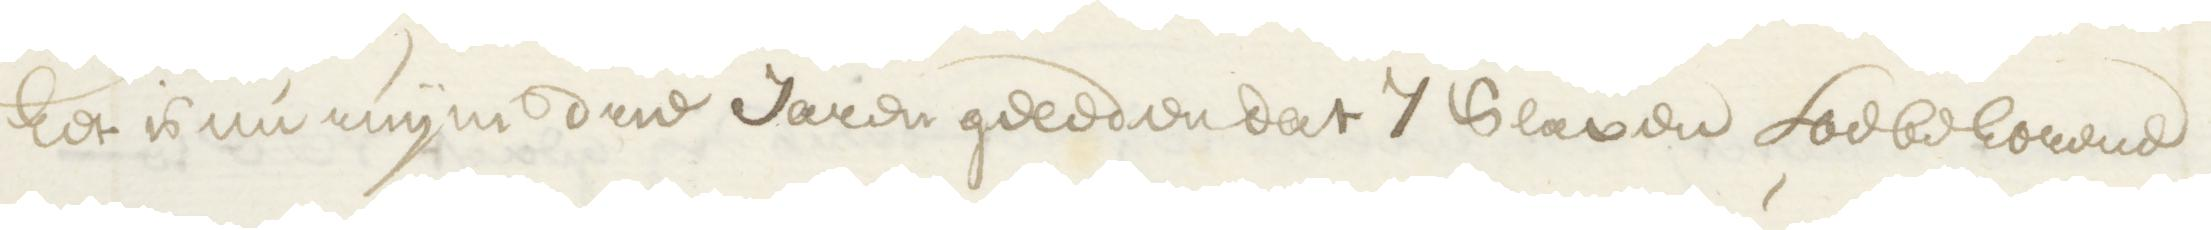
het is nu ruijm drie Iaren geleden dat 7 slaven toebehorend
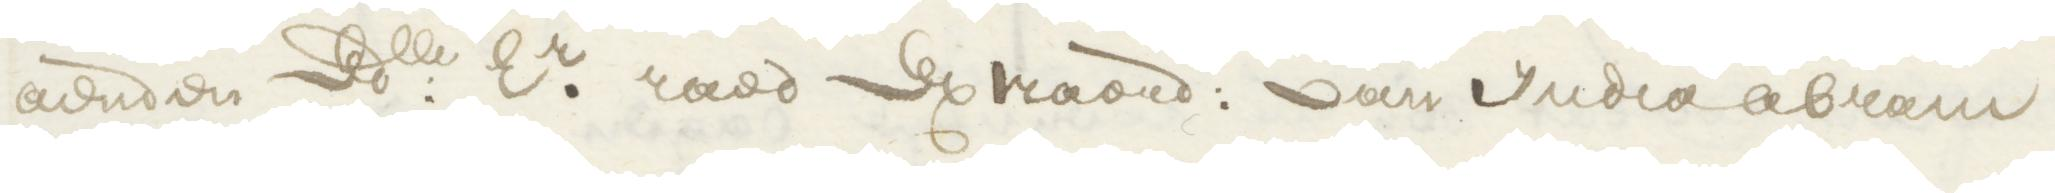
aenden Ed:le h.r raed Extraord:s van India abram
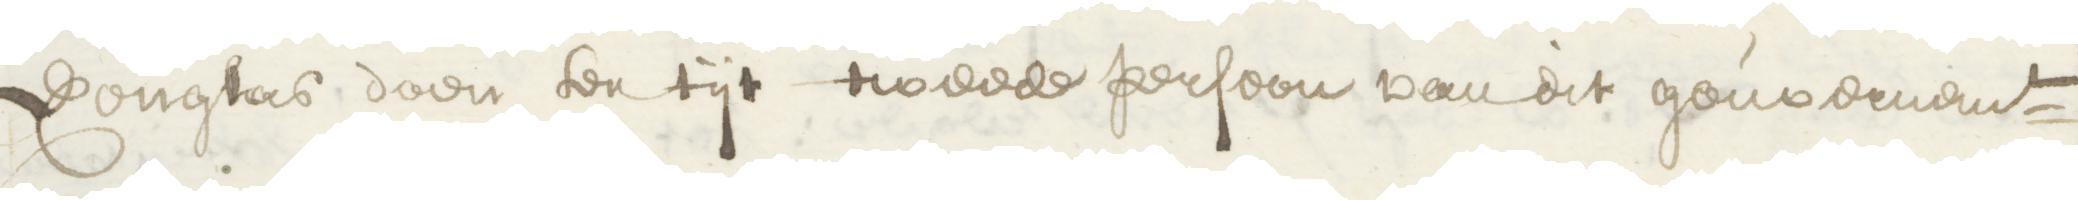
Douglas doen ter tijt tweede persoon van dit gouvernem=t
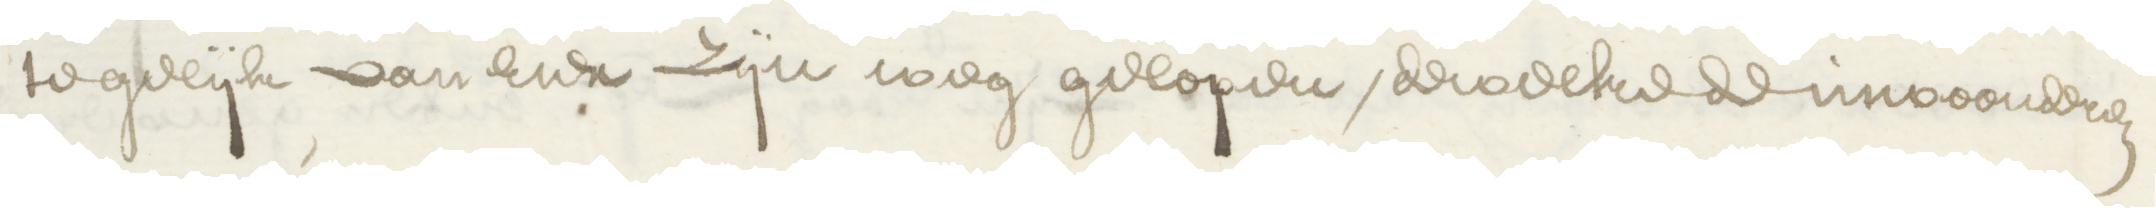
te gelijk van hier zijn weg gelopen, dewelke de inwoonderen
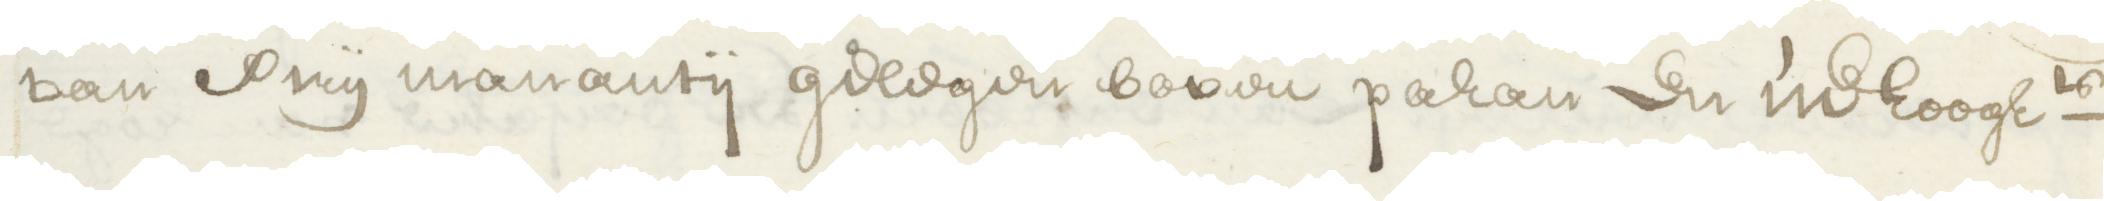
van surij manantij gelegen boven pahan en uE hooghts
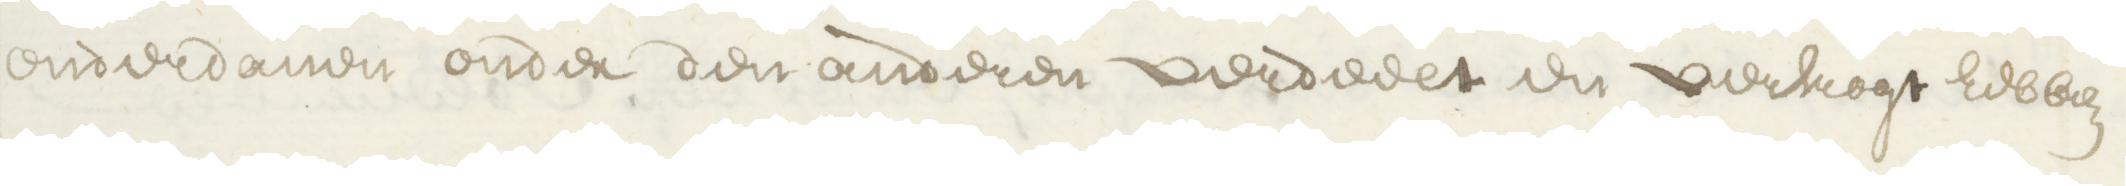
onderdanen onder den anderen verdeelt en verkogt hebben
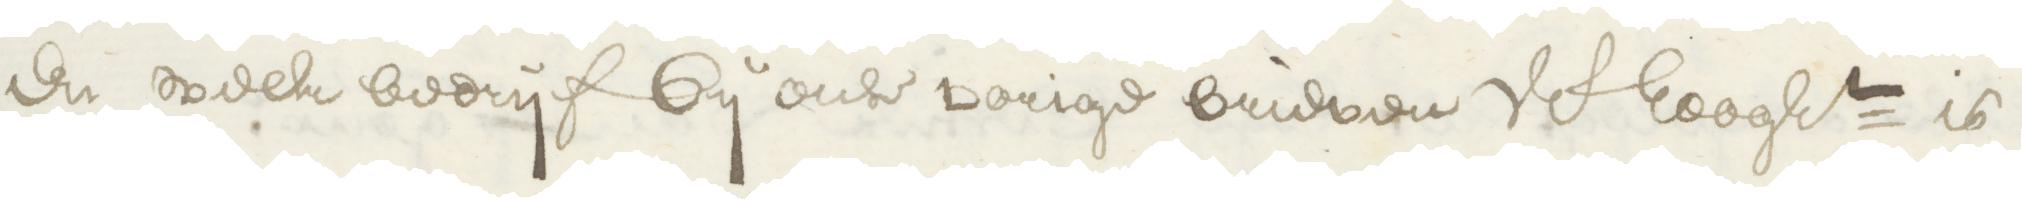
en welk bedrijf bij onse vorige brieven vE hoogh=t is
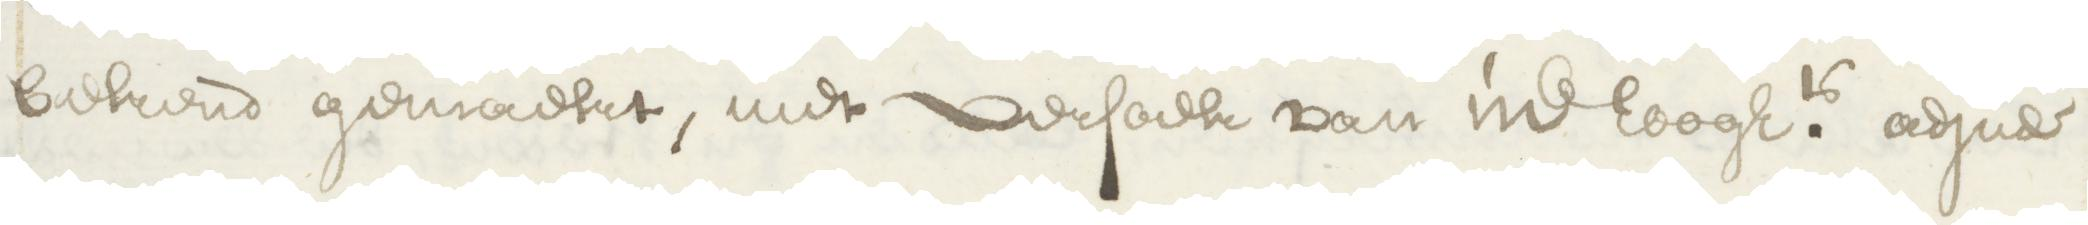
bekend gemaekt, met versoek van uE hoogh.ts adjude
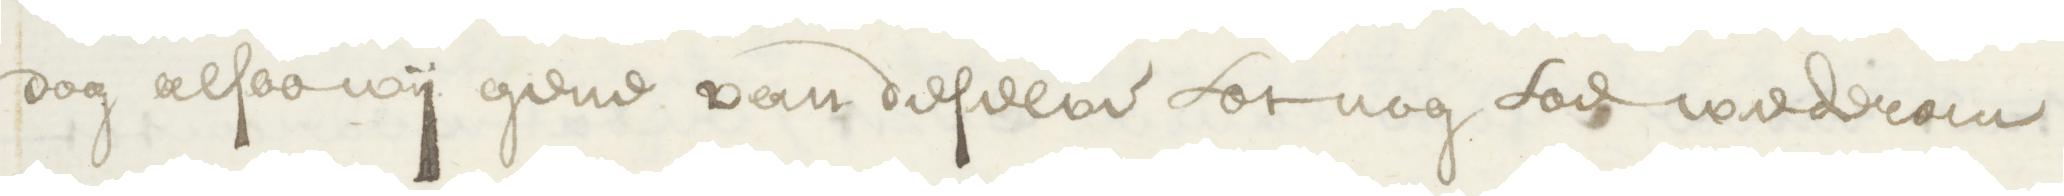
dog alsoo wij gene van deselve tot nog toe wederom
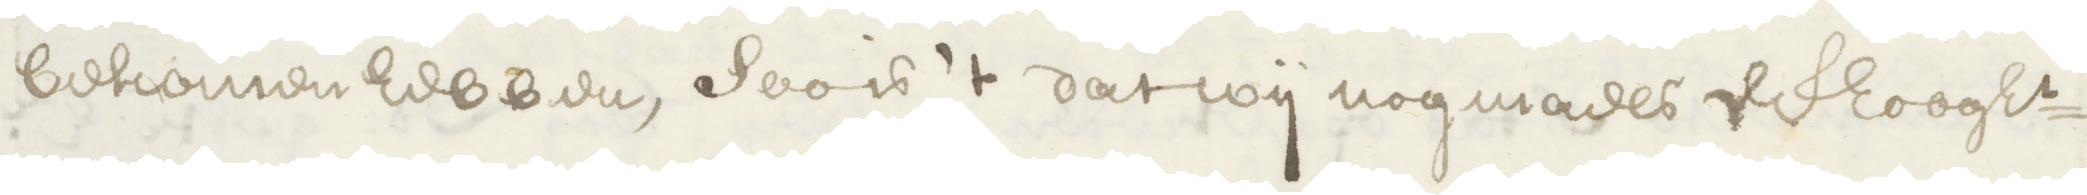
bekomen hebben, soo is 't dat wij nogmaels vE hoogh=t
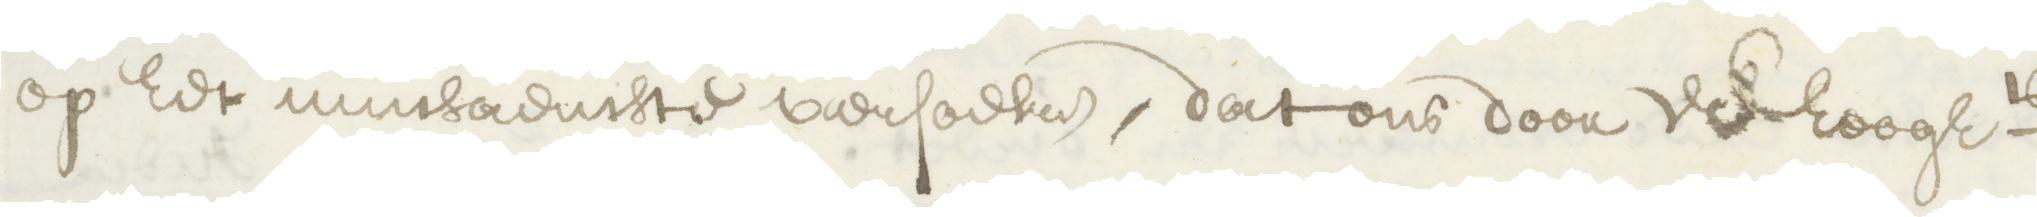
op het minsaemste versoeken, dat ons door vE hoogh=t
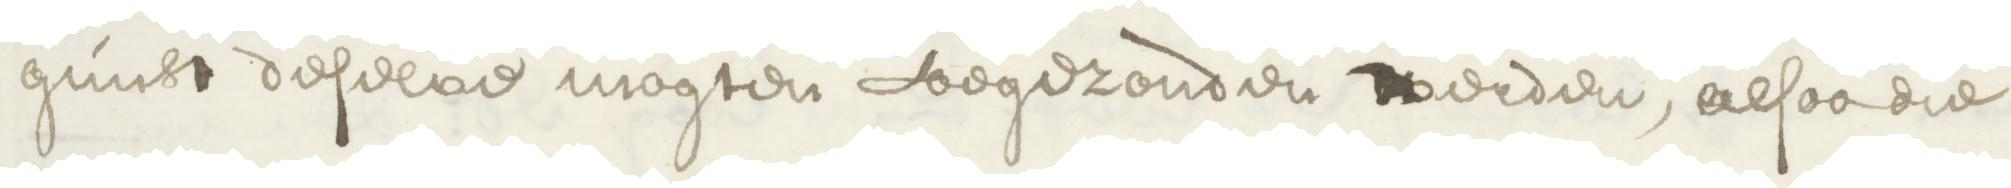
gunst deselve mogten toegezonden werden, alsoo die
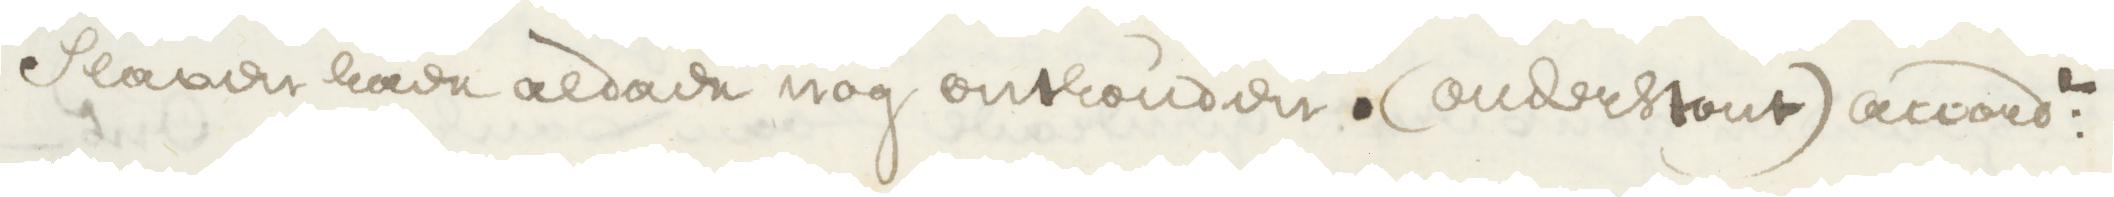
slaven haer aldaer nog onthouden. (onderstont) accord:t
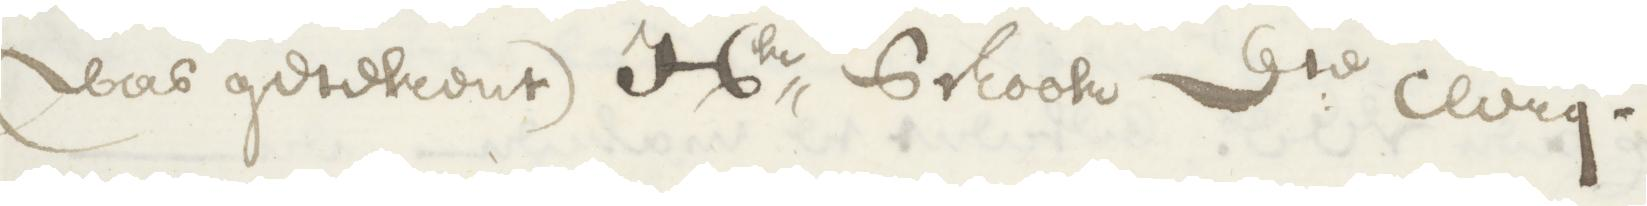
(was getekent) H„k schook E:te clerq:
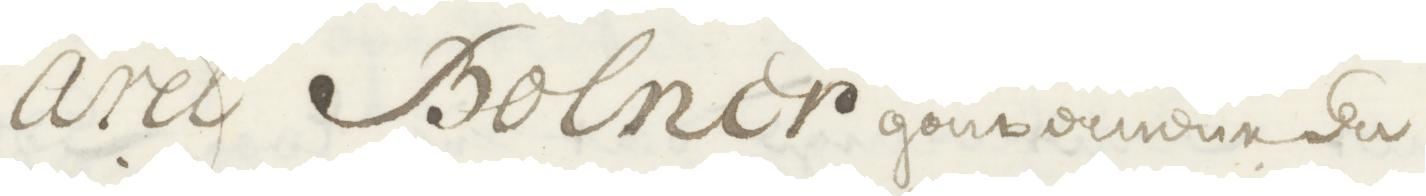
arel Bolner gouverneur en
